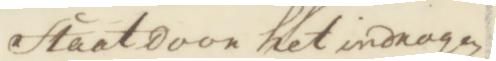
staat door het indragen
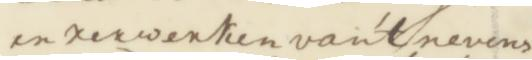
en verwerken van 't nevens
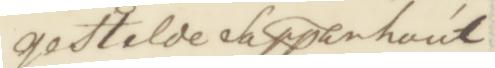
gestelde sappanhout
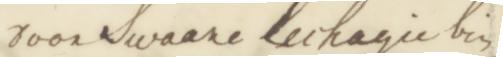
door swaare leckagie bin
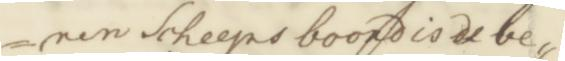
=nen scheeps boord is de be„
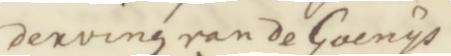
derving van de Goenijs
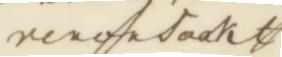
verorsaakt
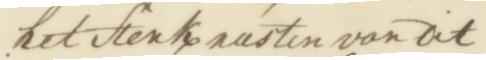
het sterk rusten van dit
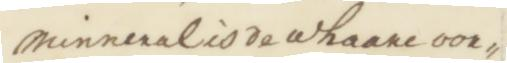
minneral is de whaare oor„
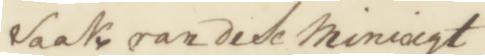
saak van dese miniagt
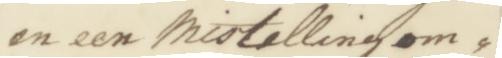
en een mistelling om„
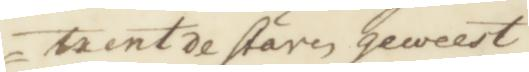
„trent de staven geweest
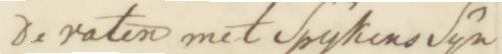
de vaten met spijkers sijn
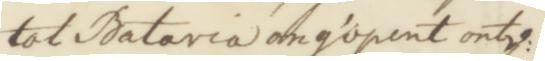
tot Batavia ong'opent ontv:
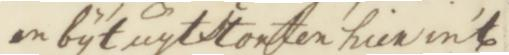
en bij 't uijtstorten hier in ’t
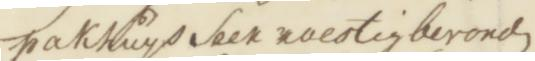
pakhuijs seer roestig bevonden
